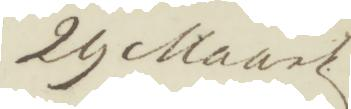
29 Maart
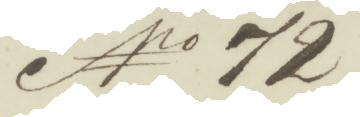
N=.o 72
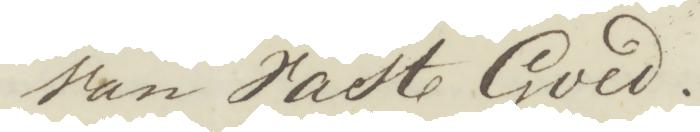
van Vast Goed.
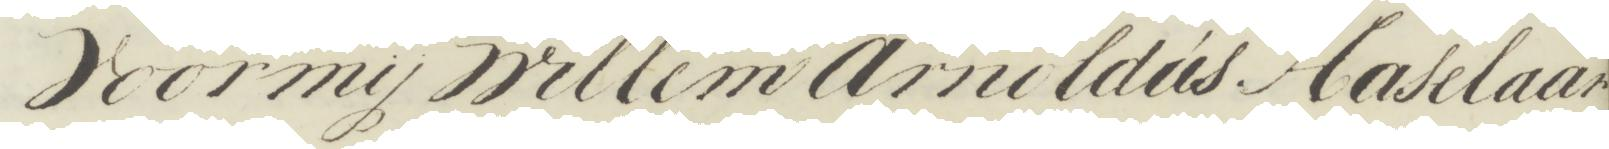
Voor mij Willem Arnoldus Haselaar
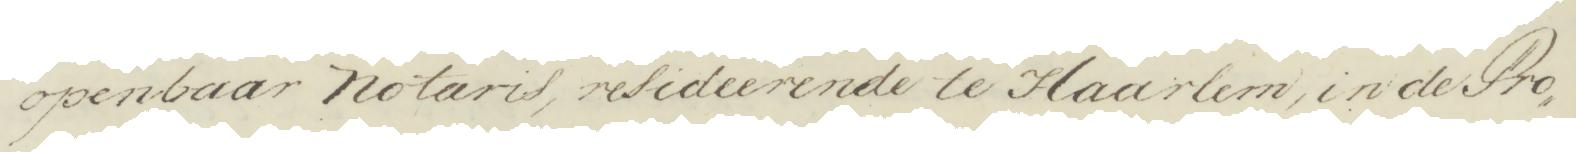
openbaar notaris, resideerende te Haarlem, in de Pro„
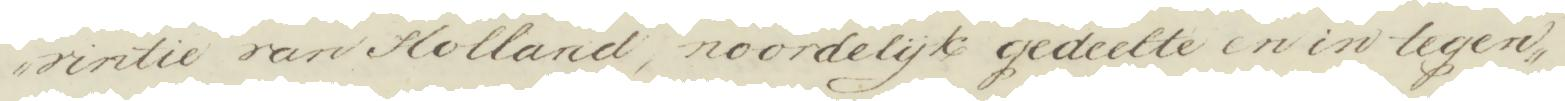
„vintie van Holland, noordelijk gedeelte en in tegen„
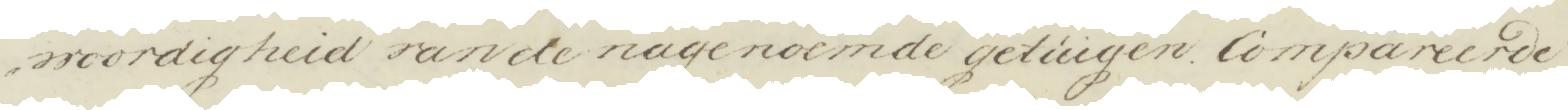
„woordigheid van de nagenoemde getuigen, compareerde
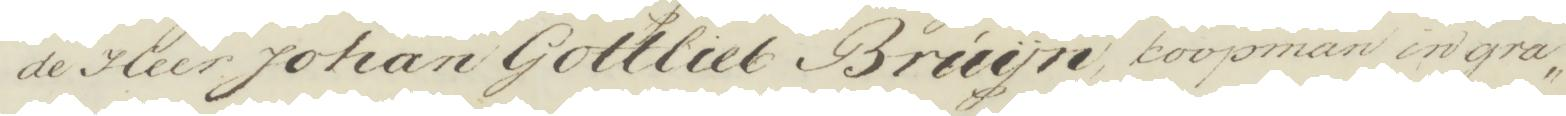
de Heer Johan Gottlieb Bruijn, koopman in gra„
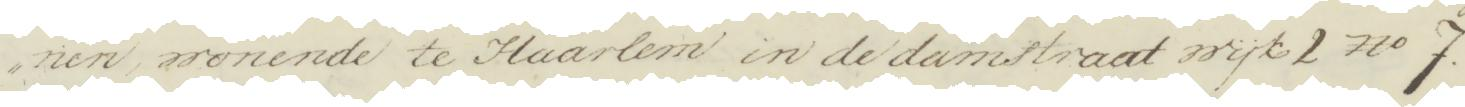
„nen, wonende te Haarlem in de damstraat wijk 2 no 7
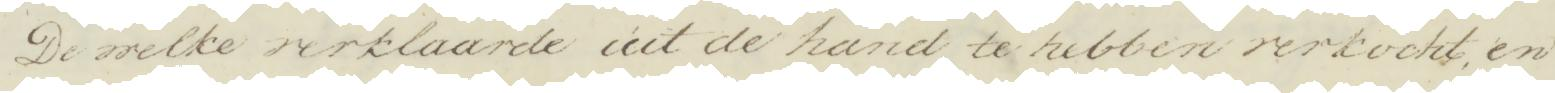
De welke verklaarde uit de hand te hebben verkocht, en
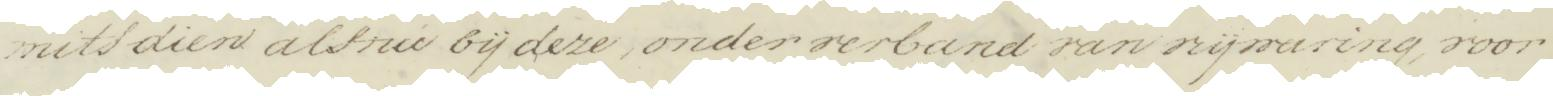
mits dien alsnu bij deze,onder verband van vrijwaring voor
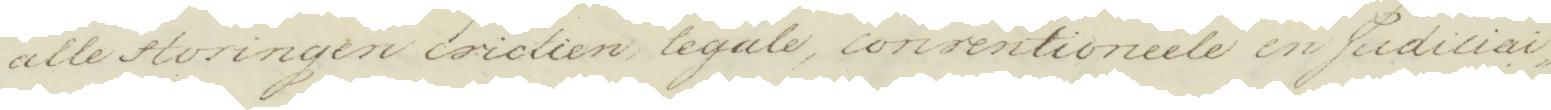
alle storingen evictien, legale, conventioneele en judiciai„
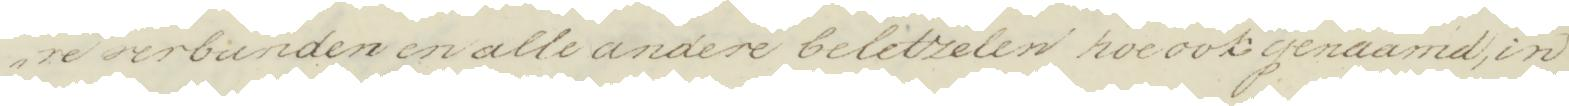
„re verbanden en alle andere beletzelen hoe ook genaamd, in
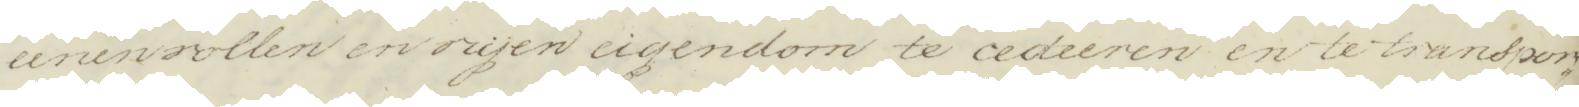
eenen vollen en vrijen eigendom te cedeeren en te transpor„
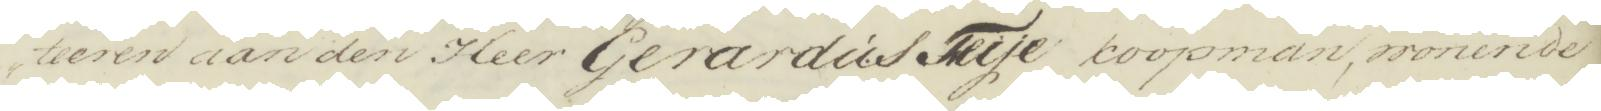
„teeren aan den Heer Gerardus Feije koopman, wonende
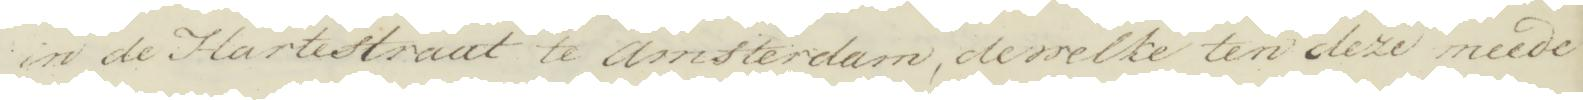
in de Hartestraat te amsterdam, dewelke ten deze meede
